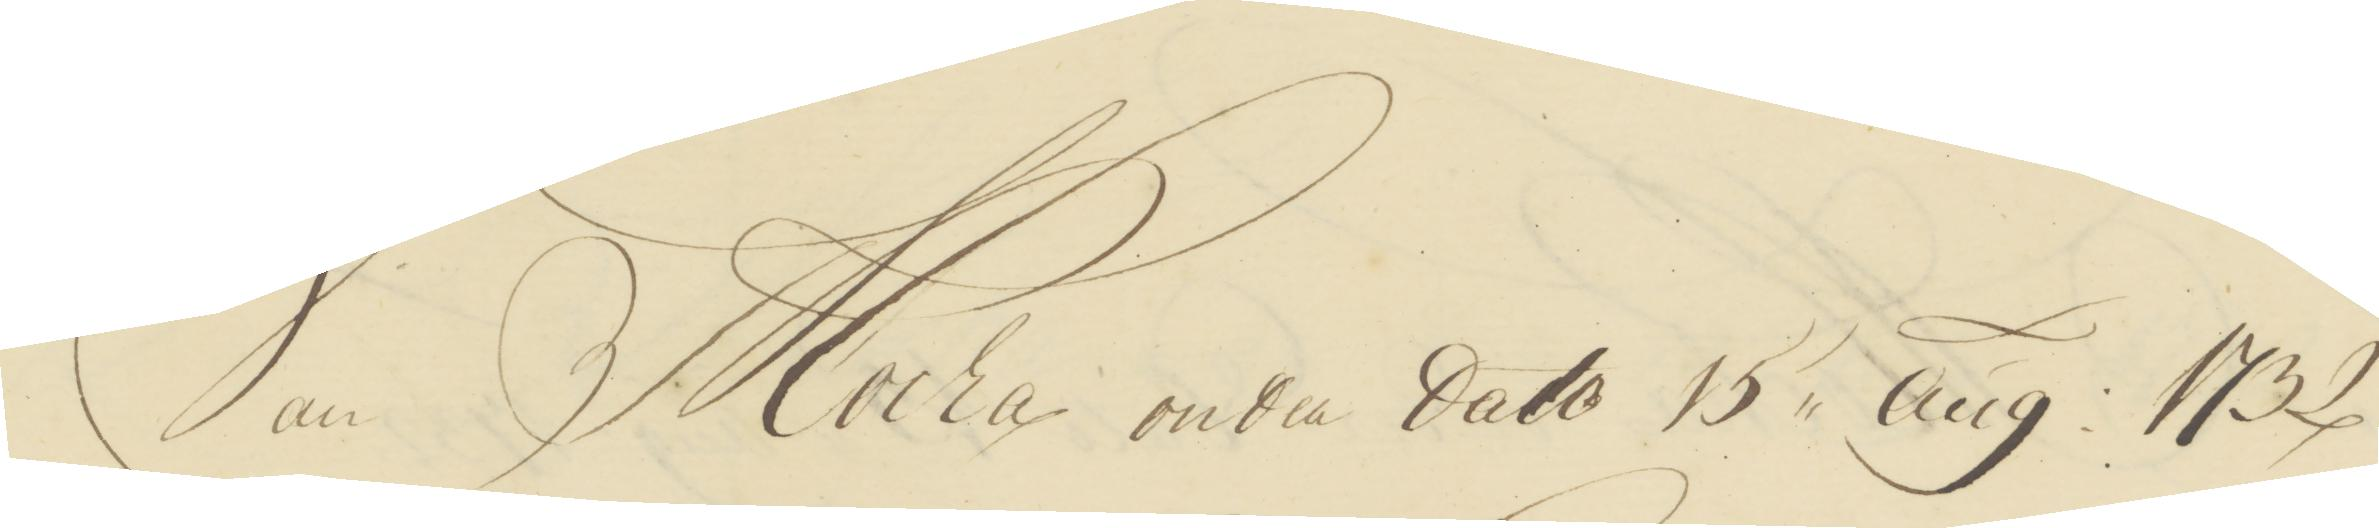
Van Mocha onder dato 15„' aug: 1732
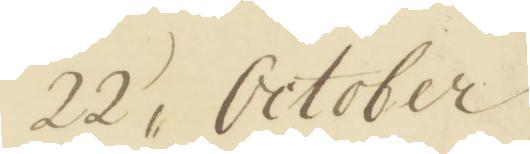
22„' october
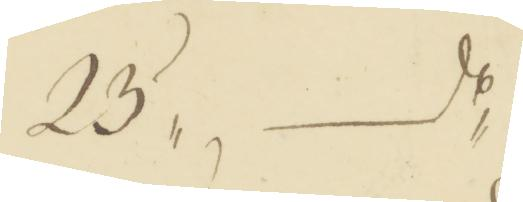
23„' _„o
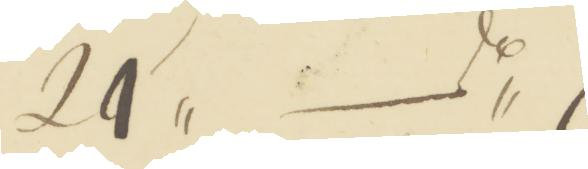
24„' _„o
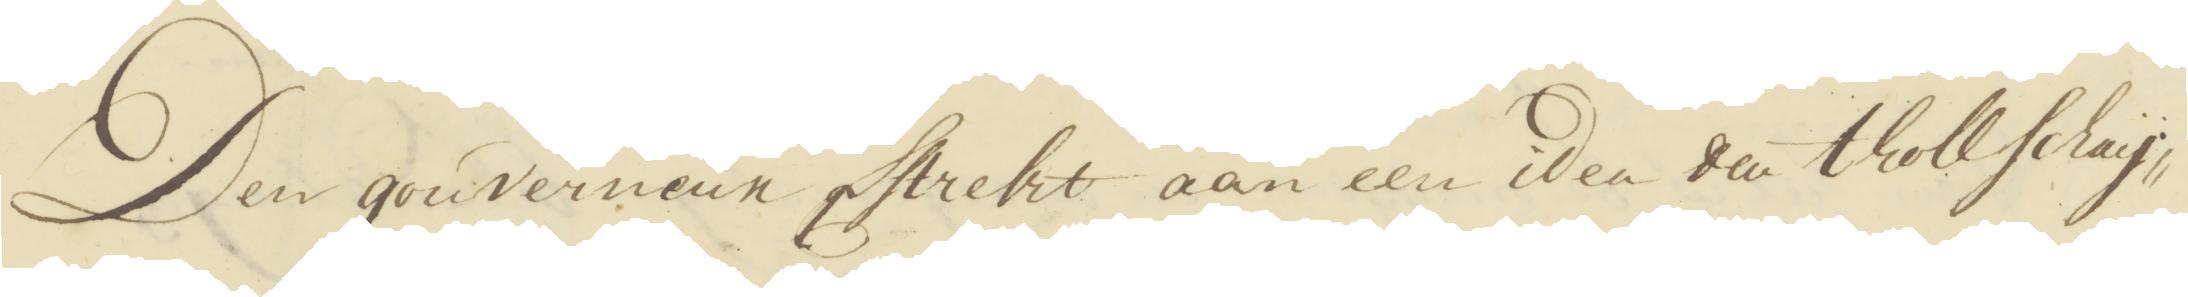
Den gouverneur verstrekt aan een ider den thollschrij„
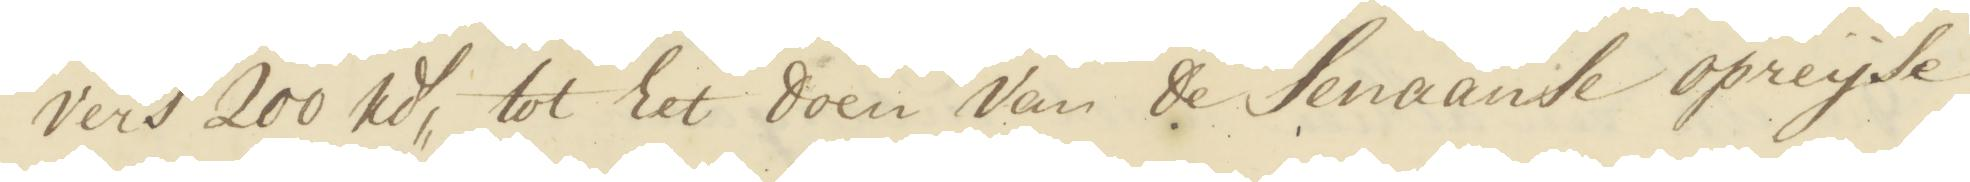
vers 200 rd„s tot het doen van de senaanse opreijse
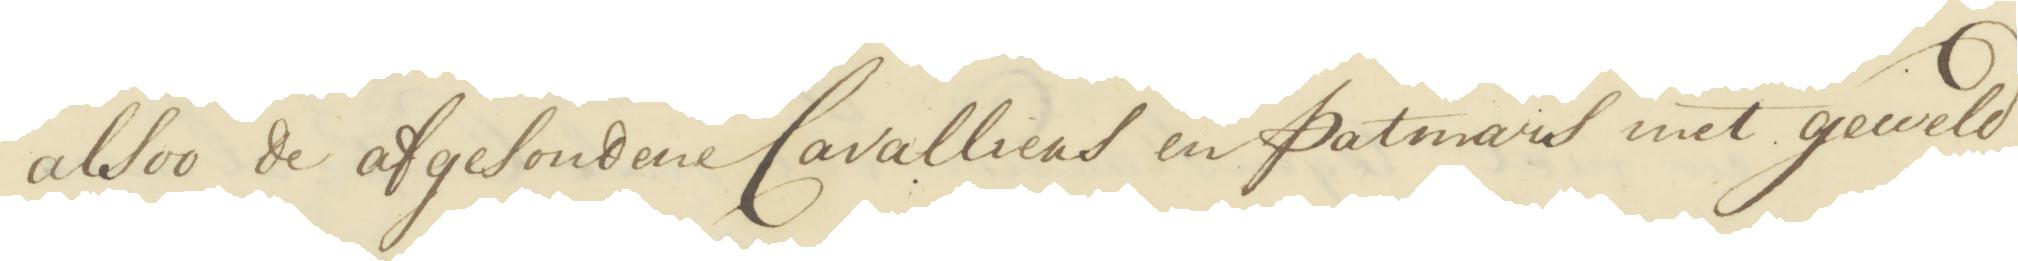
alsoo de afgesondene Cavalliers en Patmars met geweld
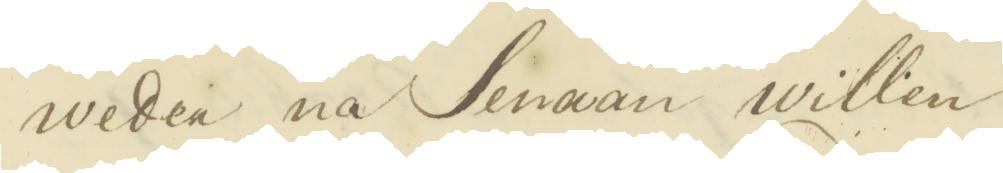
weder na Senaan willen
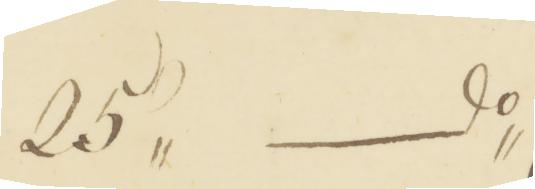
25„' _„o
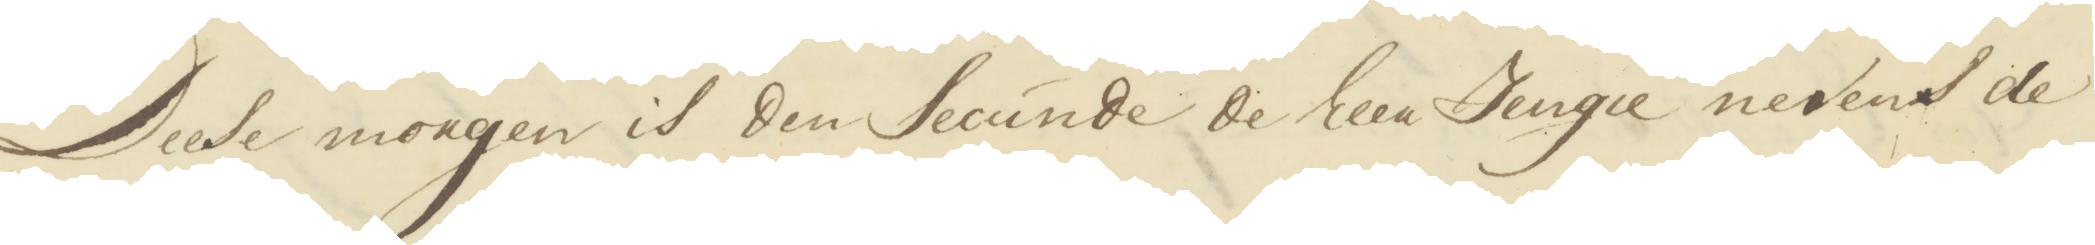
Deese morgen is den secunde de heer Iengie nevens de
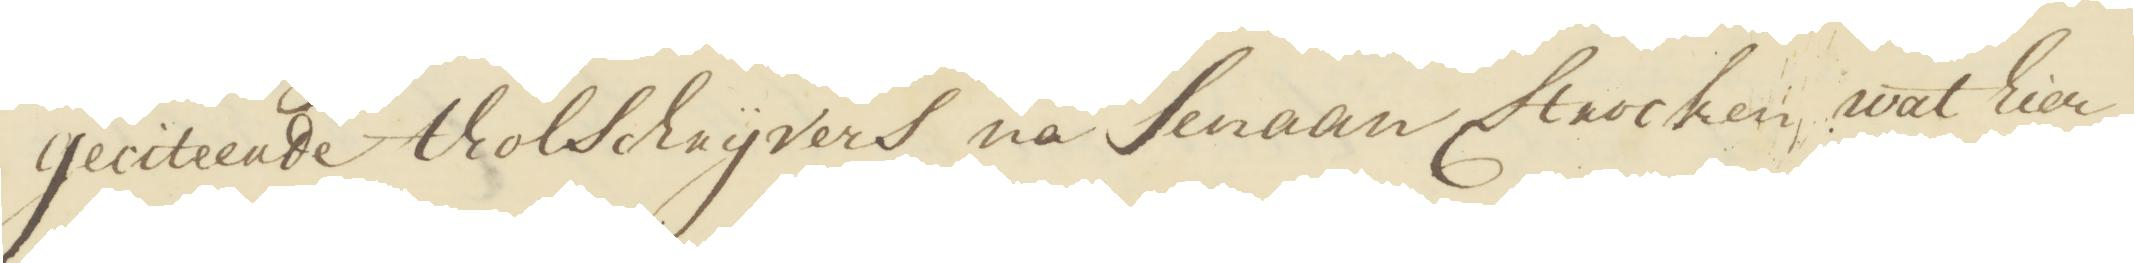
geciteerde tholschrijvers na senaan vertrocken, wat hier
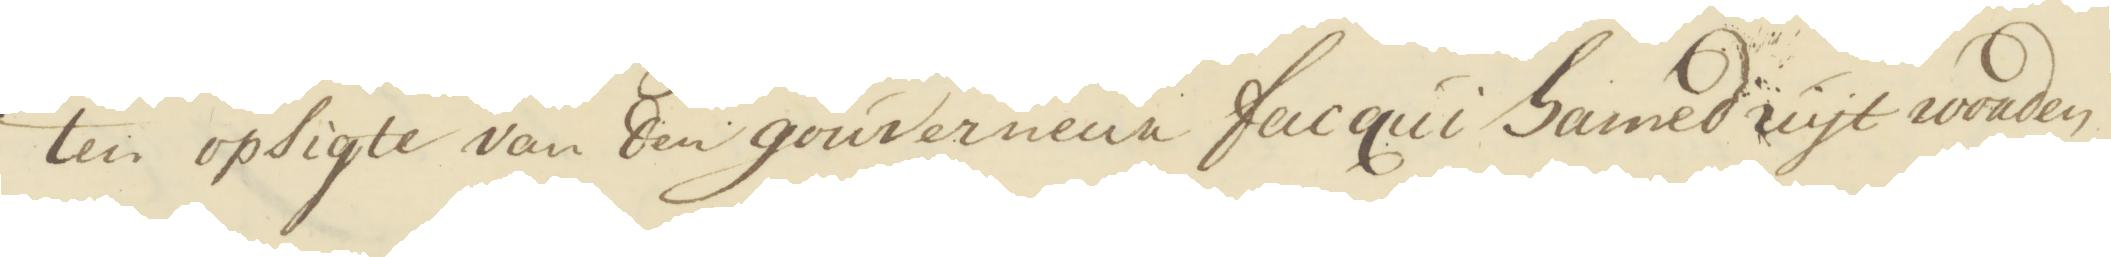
ten opsigte van den gouverneur facqui hamed uijt worden
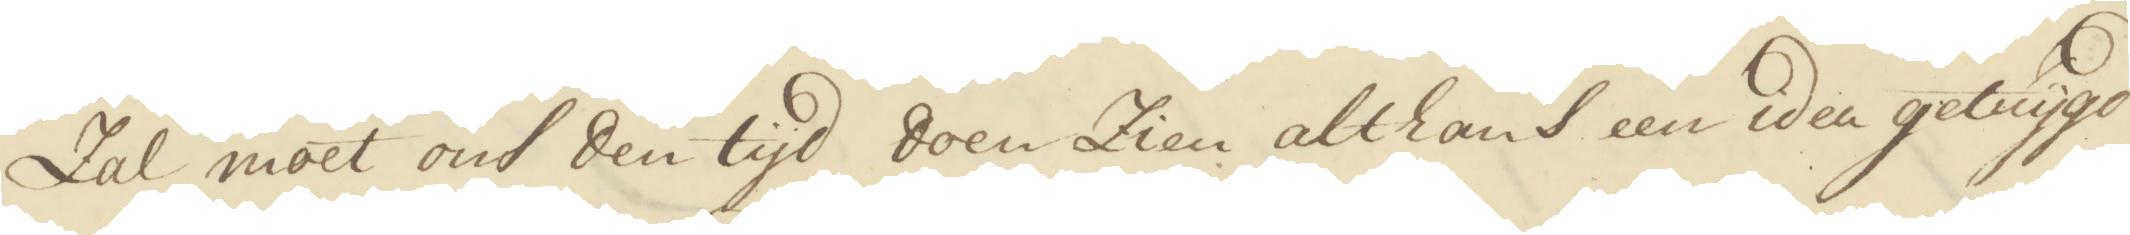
zal moet ons den tijd doen zien althans een ider getuijgd
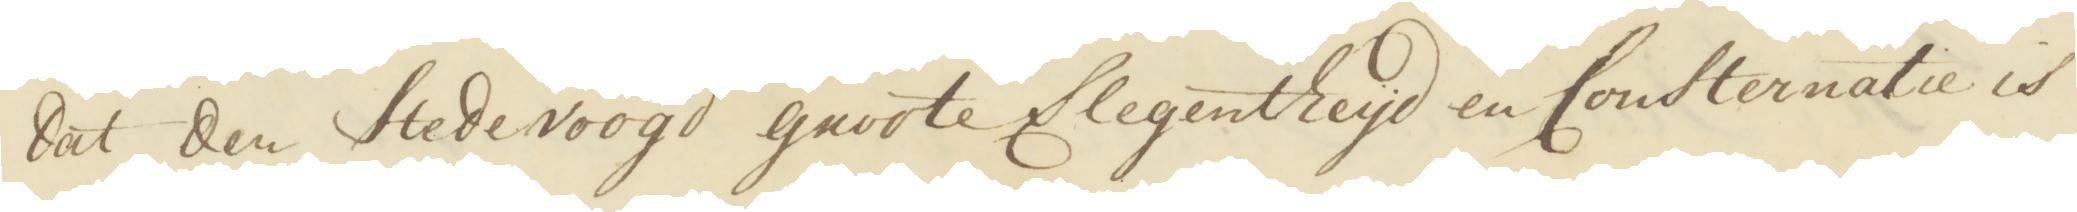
dat den stede voogd groote verlegentheijd en Consternatie is
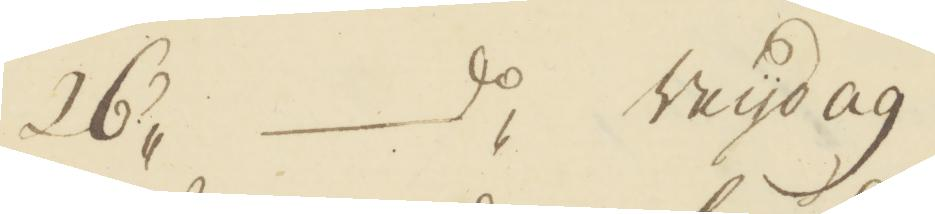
26„' _„o vrijdag
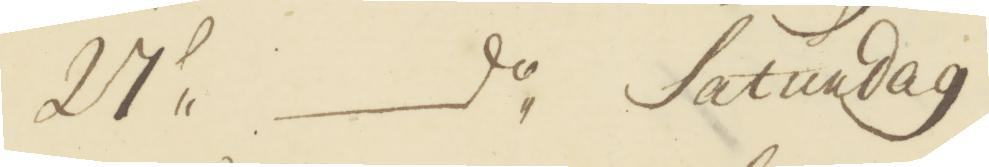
27„' _„o saturdag
